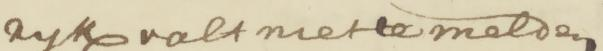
ryk valt niet te melden
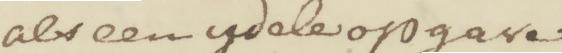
als een ydele opgave
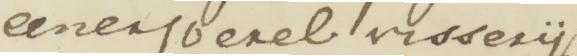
eener perel visserij
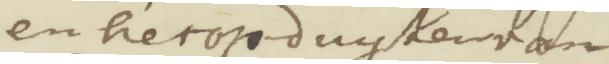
en het opduyken van
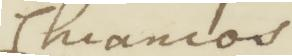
Chianios
